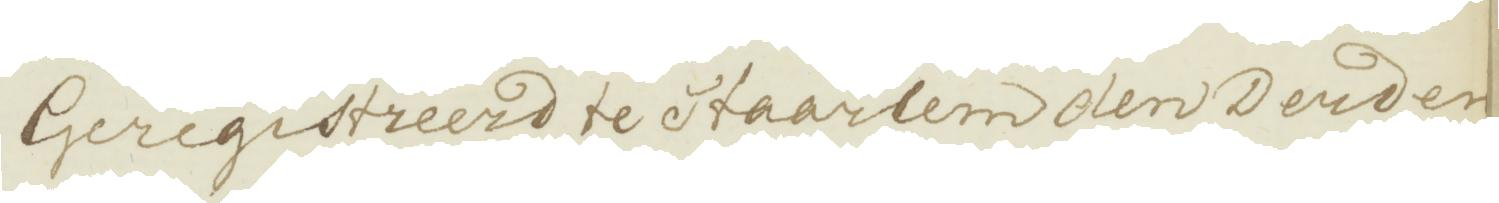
Geregistreerd te Haarlem den Derden
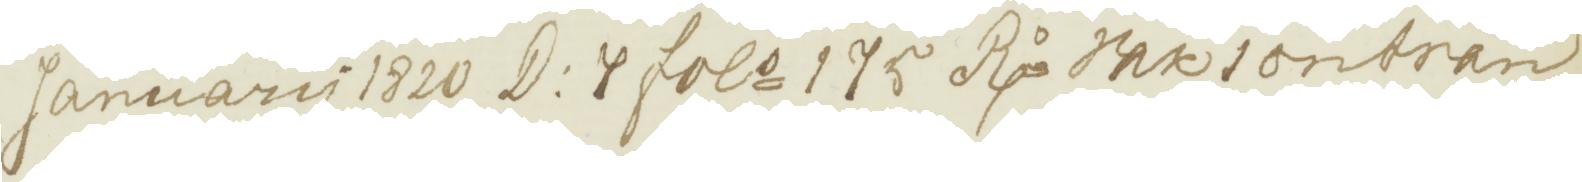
Januarij 1820, D:7V fol=o 175 R=o Vak 1 ontvan
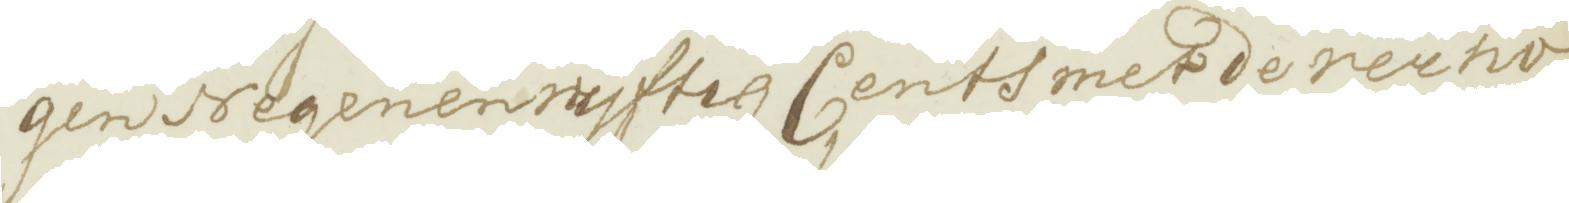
gen Negenenvyftig Cents met de verho
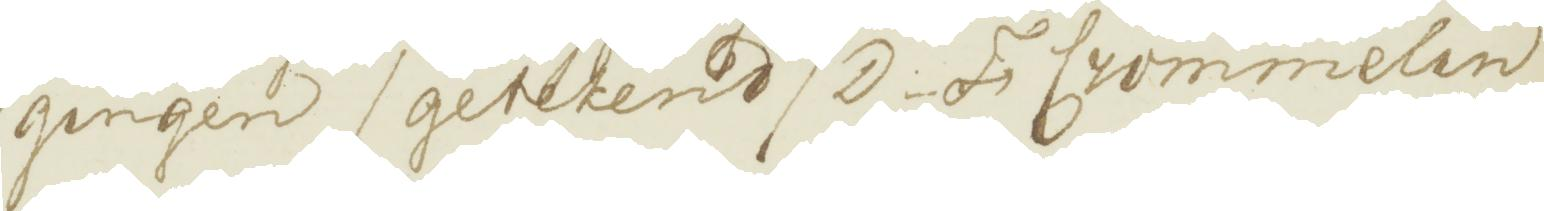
„gingen / getekend / D: F: Crommelin
